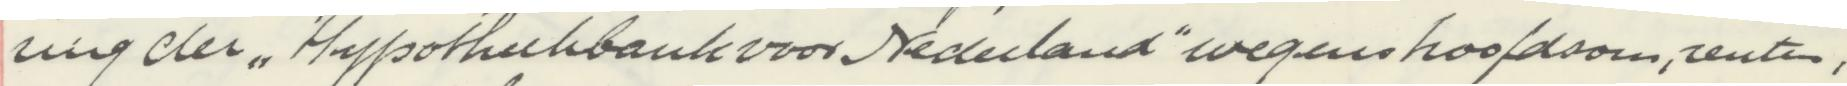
ring der „Hypotheekbank voor Nederland" wegens hoofdsom, renten,
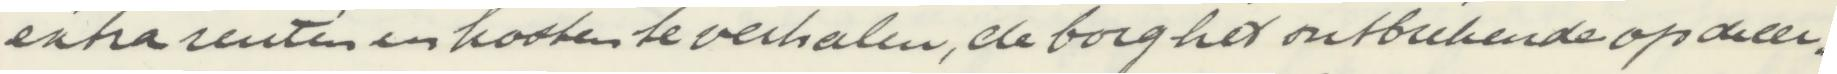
extra renten en kosten te verhalen, de borg het ontbrekende op de eer„
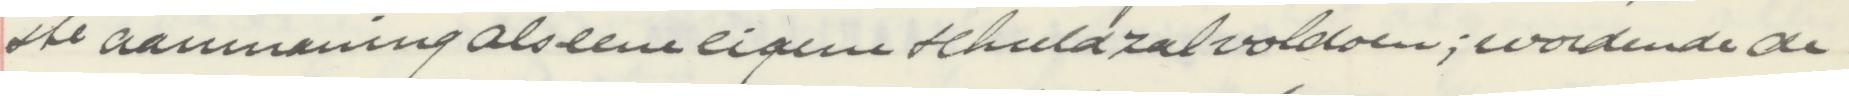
ste aanmaning als eene eigene schuld zal voldoen; wordende de
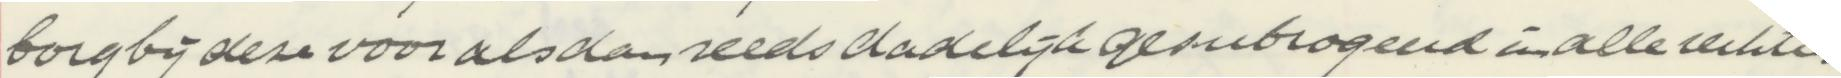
borg bij deze voor als dan reeds dadelijk gesubrogeerd in alle rechte
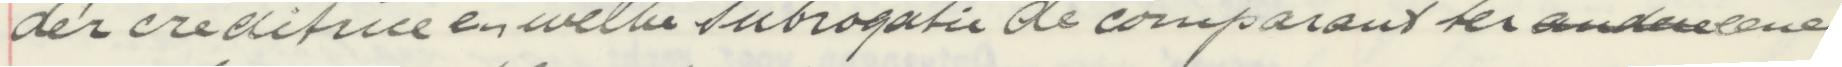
der creditrice en welke subrogatie de comparant ter andere eene
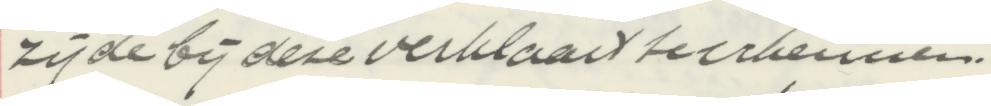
zijde bij deze verklaart te erkennen.
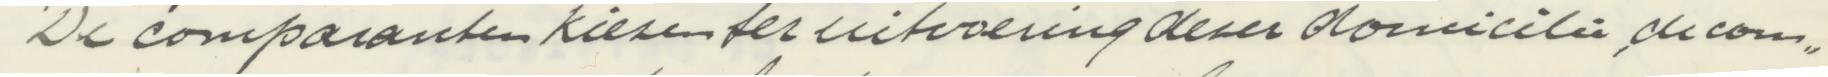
De comparanten kiezen ter uitvoering dezer domicilie de com„
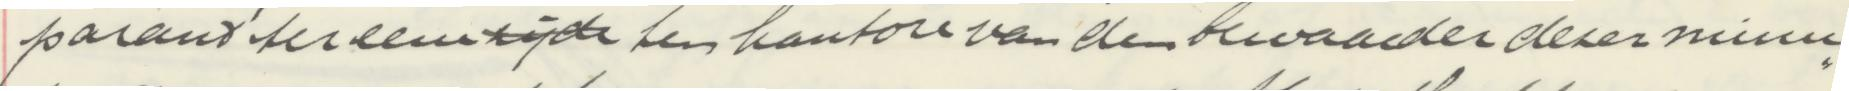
parant ter eene tijde ten kantore van den bewaarder dezer minu„
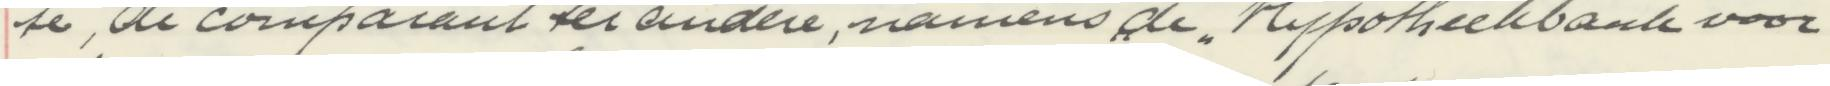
te, de comparant ter andere, namens de „Hypotheekbank voor
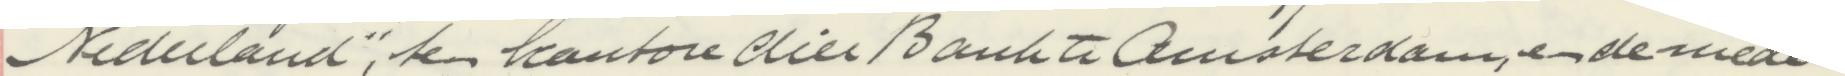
Nederland”, ten kantore dier Bank te Amsterdam, en de mede-
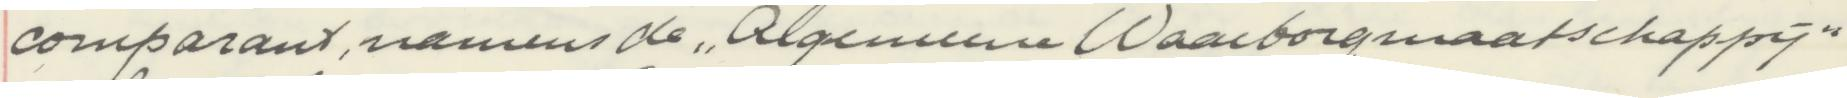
comparant, namens de „Algemeene Waarborgmaatschappij”
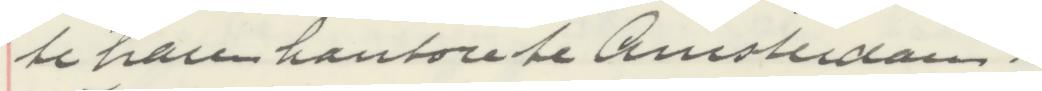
te hare kantore te Amsterdam.
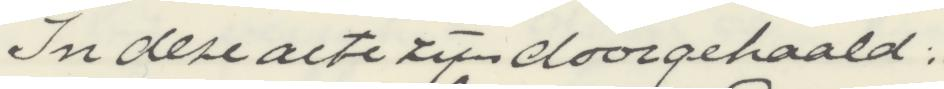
In deze acte zjn doorgehaald:
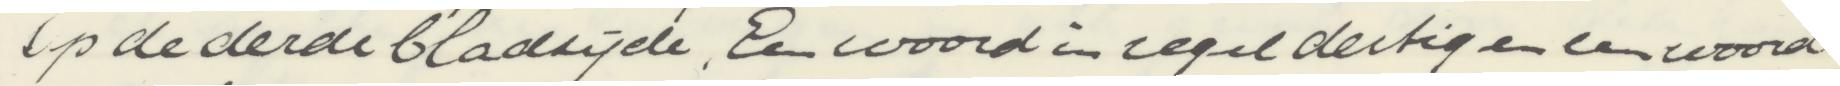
Op de derde bladzijde, Een woord in regel dertig en een woord
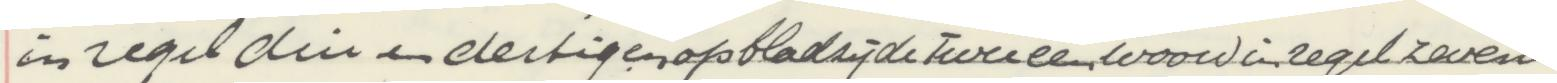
in regel drie en dertig en op bladzijde twee een woord in regel zeven
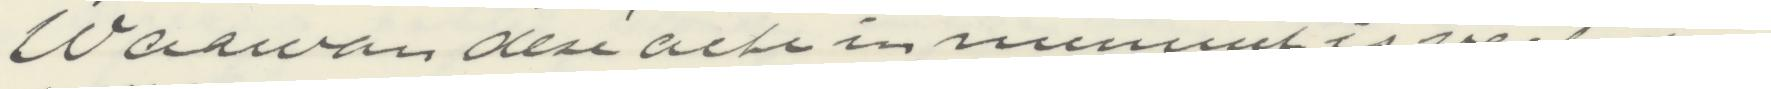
Waarvan deze acte in minuut is verleden
